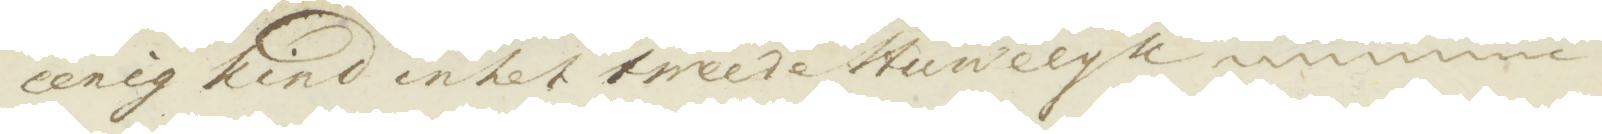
eenig kind in het tweede Huwelyk
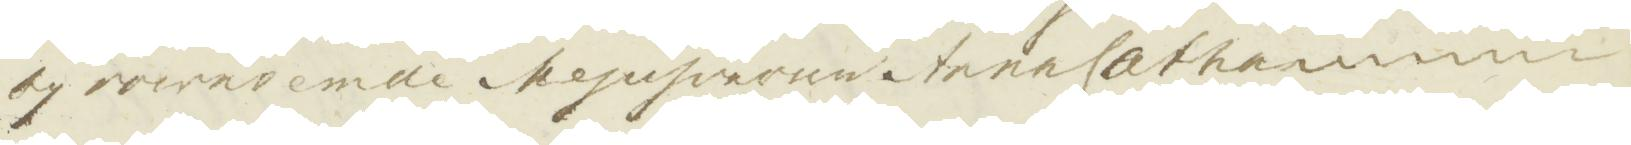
by voernoemde Mejufvrouw Anna Catha
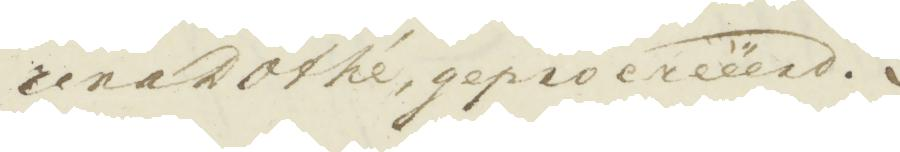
rina Dothé, geprocreëerd. —
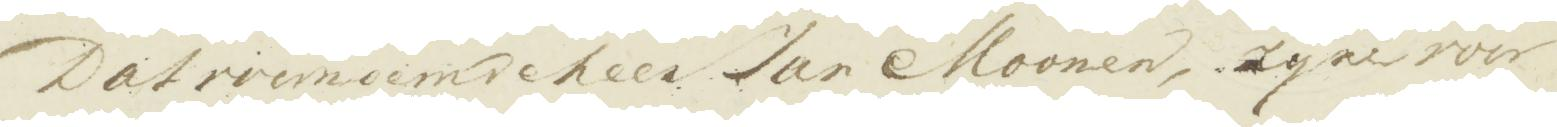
Dat voernoemde heer Ian Moonen, zyne voor
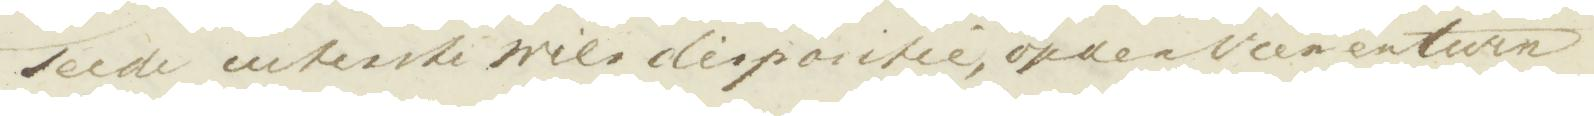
seide uiterste wils dispositie, op den vier en twin
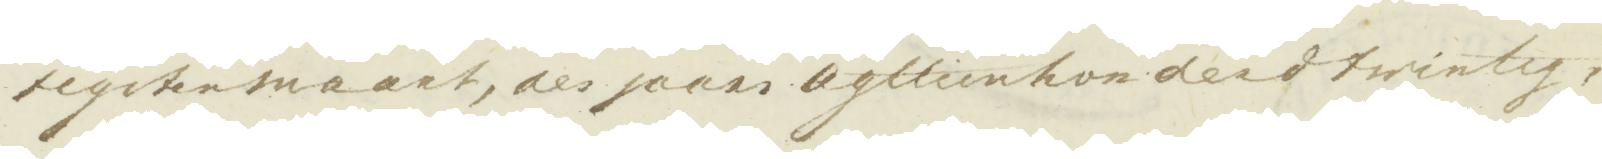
tigsten maart, des jaars agttien honderd twintig
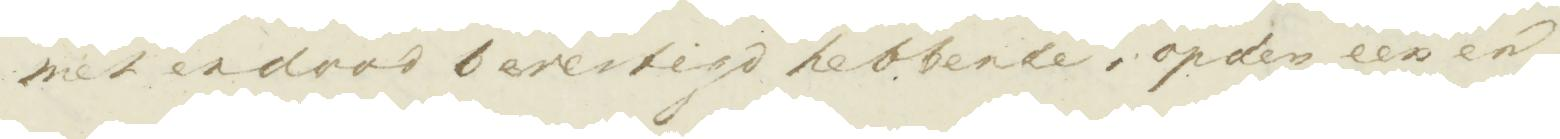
met er dood bevestigd hebbende, op den een en
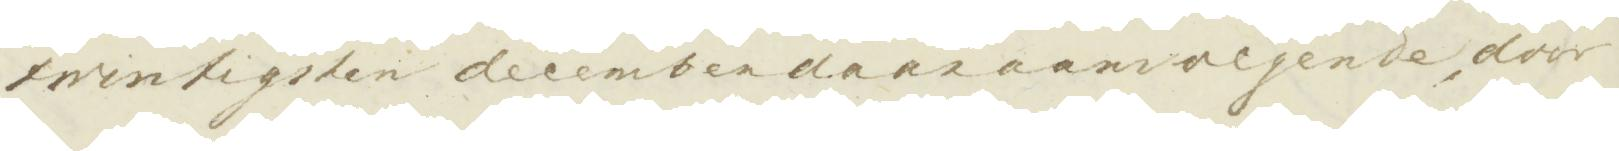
twintigsten december daaraan volgende, door
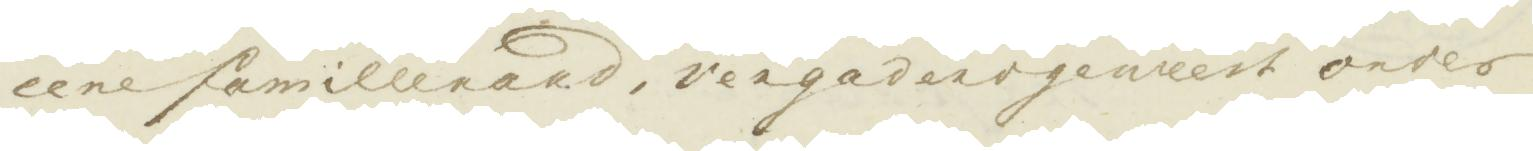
eene familleraad, vergaderd geweest onder
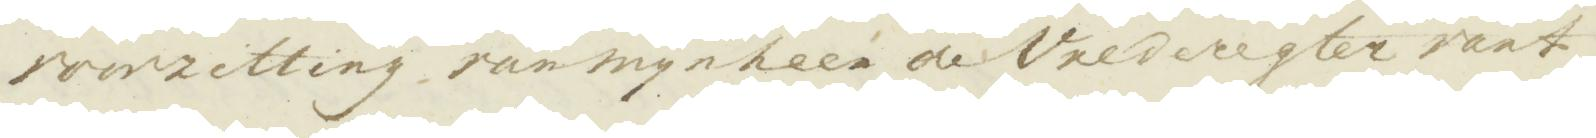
voorzitting van mynheer de Vrederegter van 't
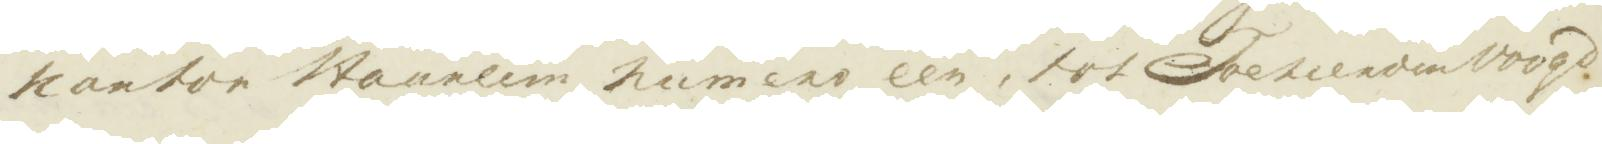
kanton Haarlem numero eën, tot Toezienden voogd
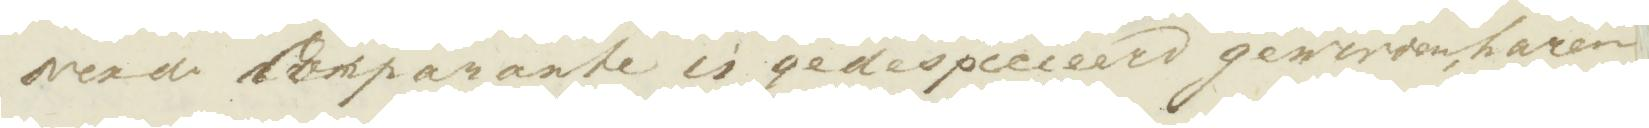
over de Comparante is gedespicieerd gewerden, haren
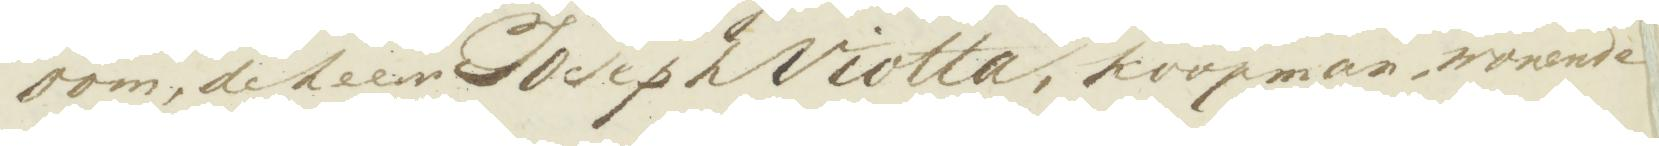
oom, de heer Ioseph Viotta, koopman, wonende
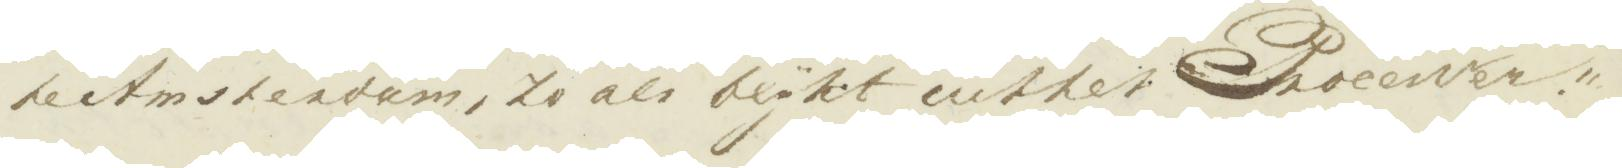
te Amsterdam, zo als blijkt uit het Procesver.„
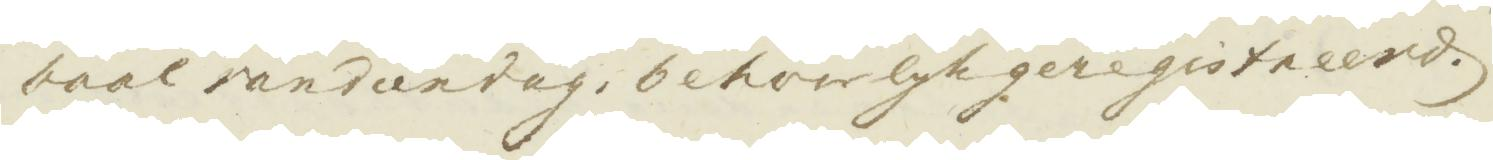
baal van dien dag, behoorlijk geregistreerd.
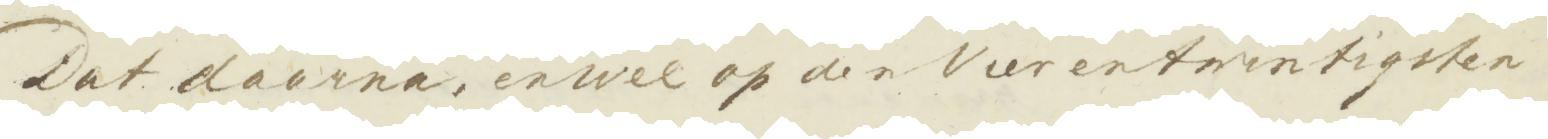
Dat daarna, en wel op den vier en twintigsten
